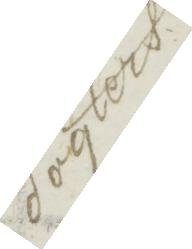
dogters
